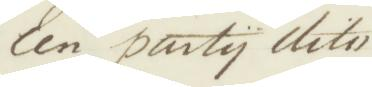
Een partij dito
